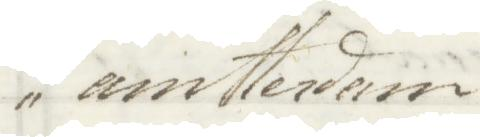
„ amsterdam
